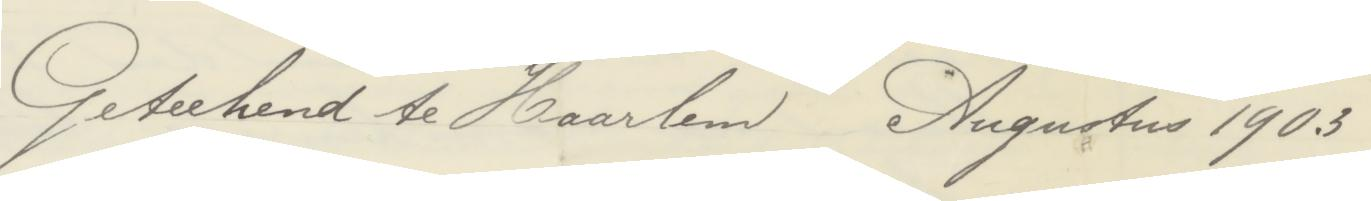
Geteekend te Haarlem Augustus 1903
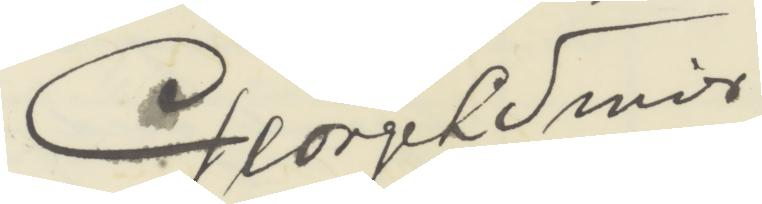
George L Smit
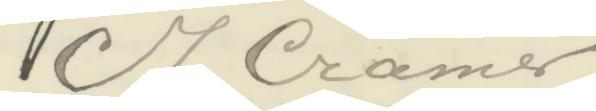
C.J. Cramer
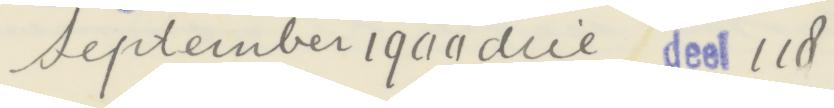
September 1900 drie
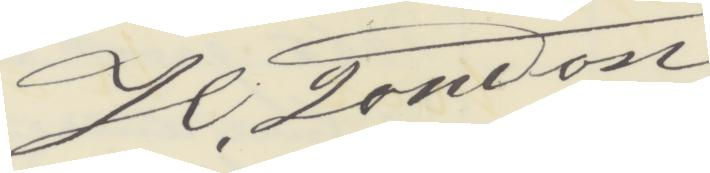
H. London
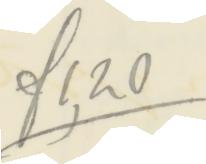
ƒ1,20
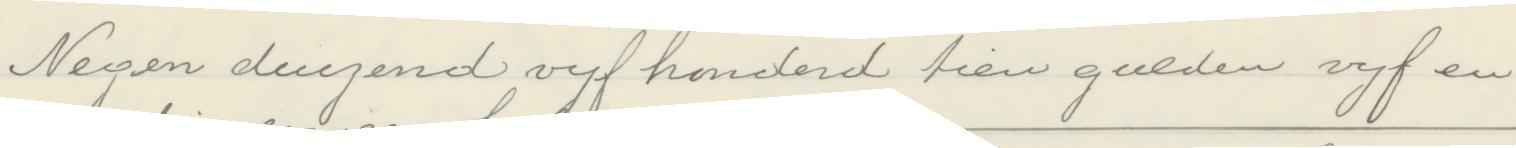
Negen duizend vyf honderd tien gulden vijf en
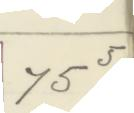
755
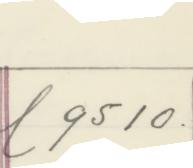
ƒ9510
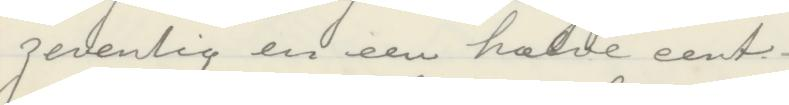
zeventig en een halve cent.
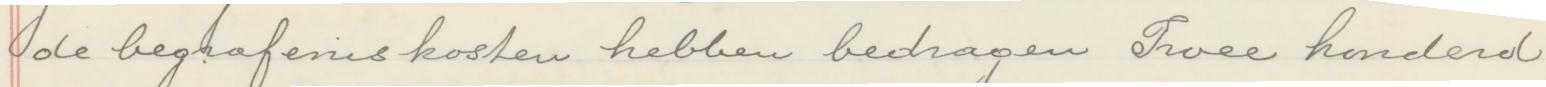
de begrafenis kosten hebben bedragen Twee honderd
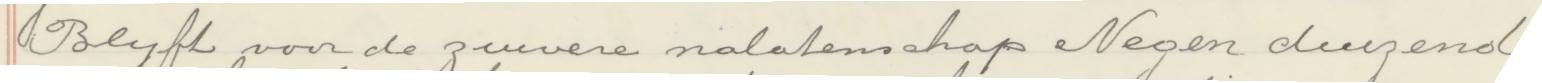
Blyft voor de zuivere nalatenschap Negen duizend
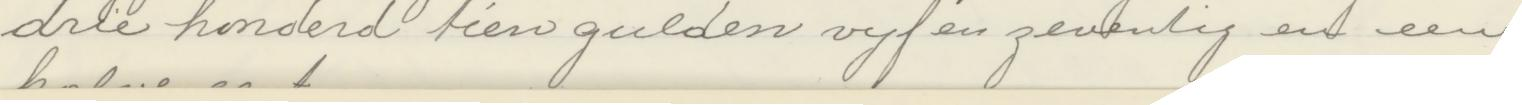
drie honderd tien gulden vyf en zeventig en een
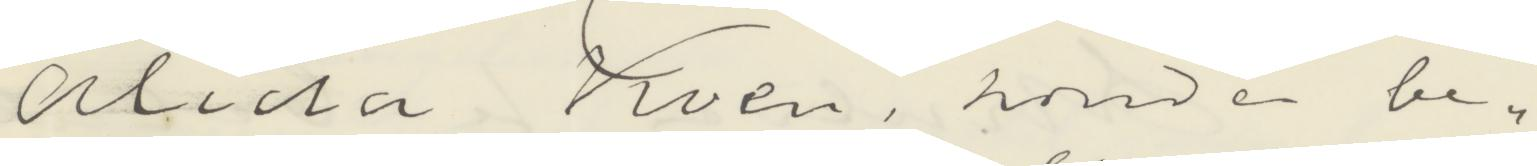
Alida Koen, zonder be„
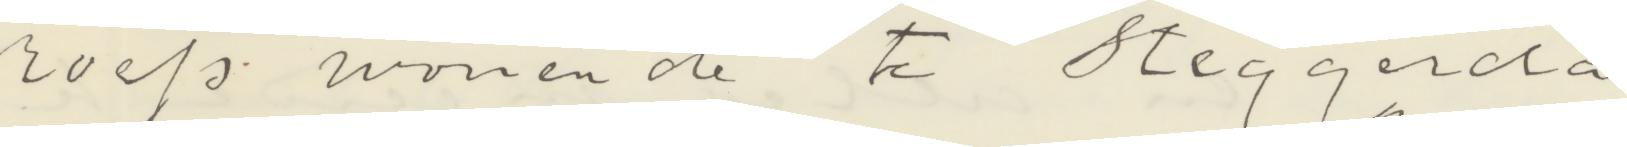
roep wonende te Steggerda
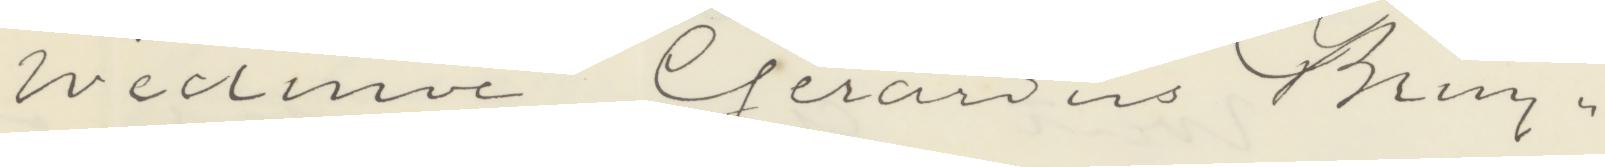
weduwe Gerardus Bruy„
